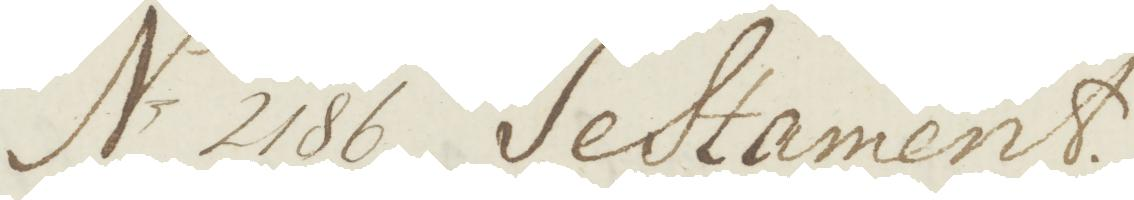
N=o 2186. Testament.
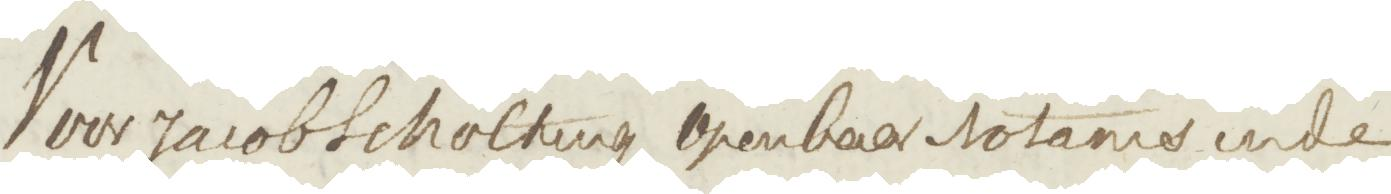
Voor Jacob Scholting Openbaar Notaris inde
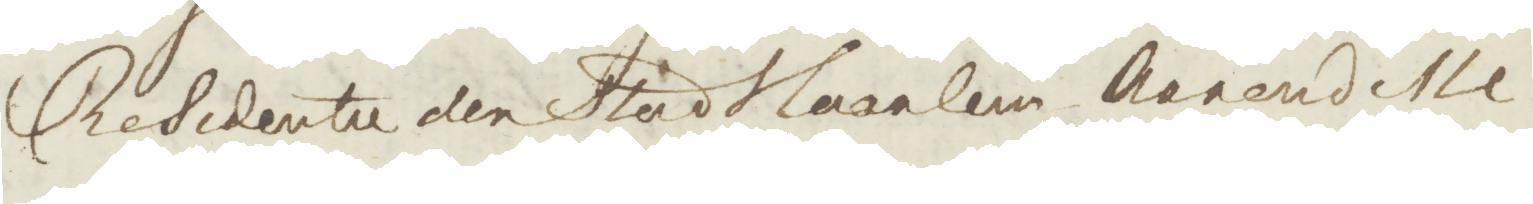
Residentie der stad Haarlem Aarondisse
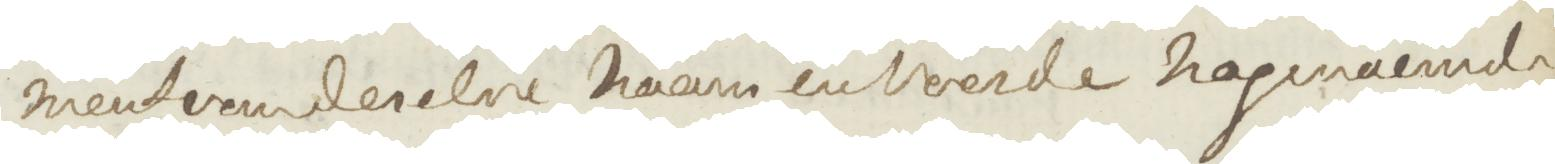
ment van deselve naam en voor de nagenoemde
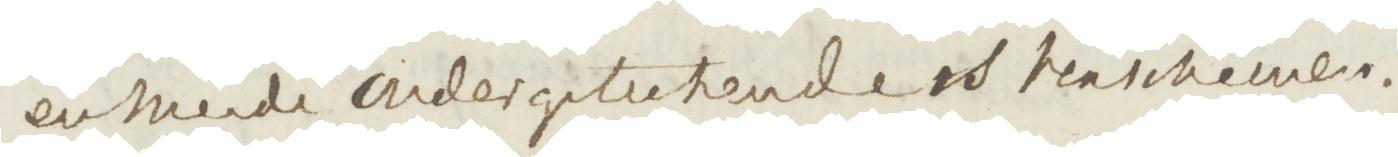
en meede ondergeteekende is verscheenen.
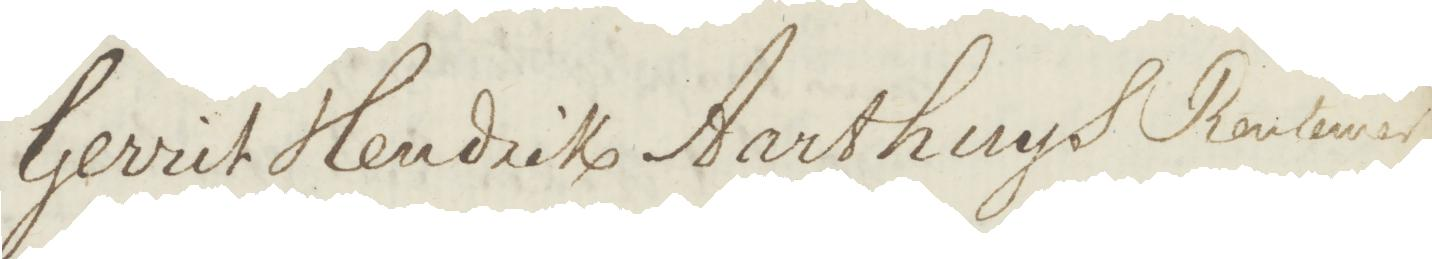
Gerrit Hendrik Aart huys Rentenier
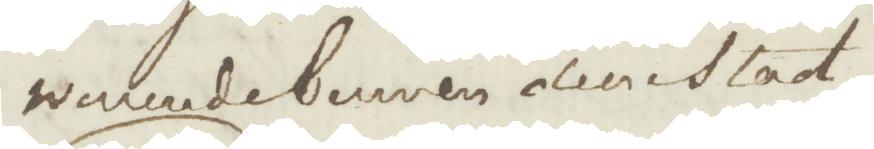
wonende binnen deese staat
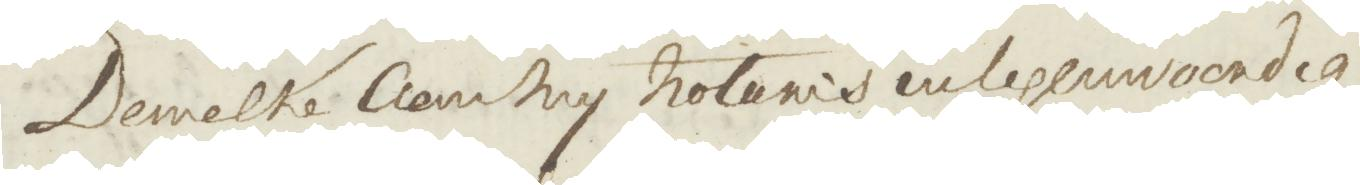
Dewelke Aan my notaris in tegenwoordig
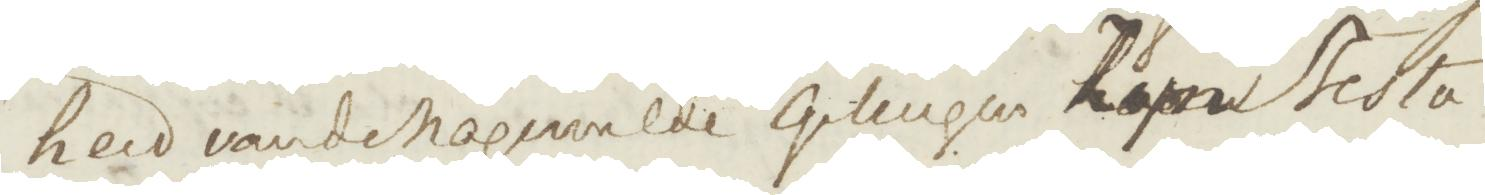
heid van de nagemelde getuigen Zyn Testa
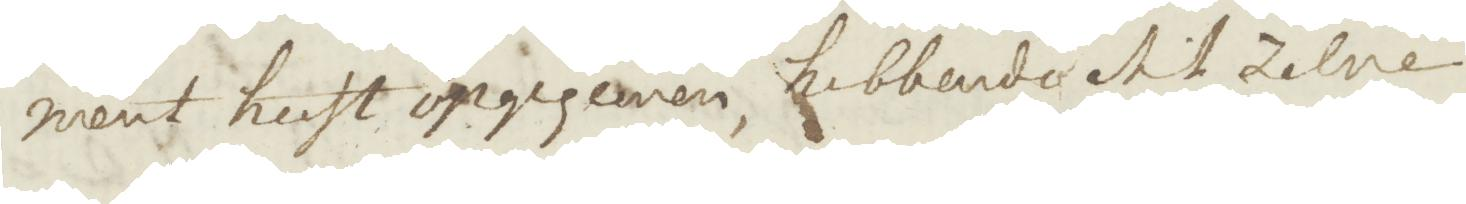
ment heeft opgegeeven, hebbende ik ’t zelve
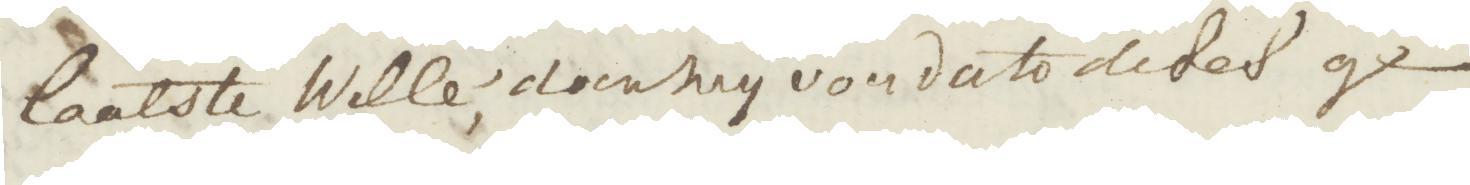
laatste Wille; dien wy voer dato deses ge
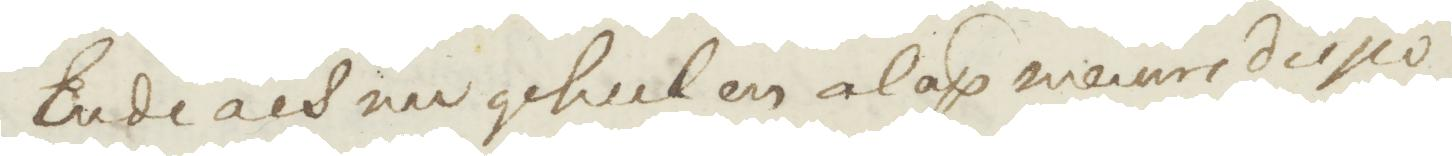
Ende als nu geheel en al op nieuwe depo
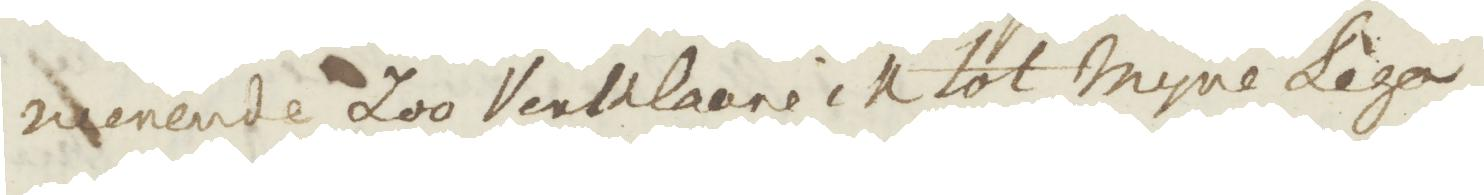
neerende, zoo Verklaare ik tot myne Lega
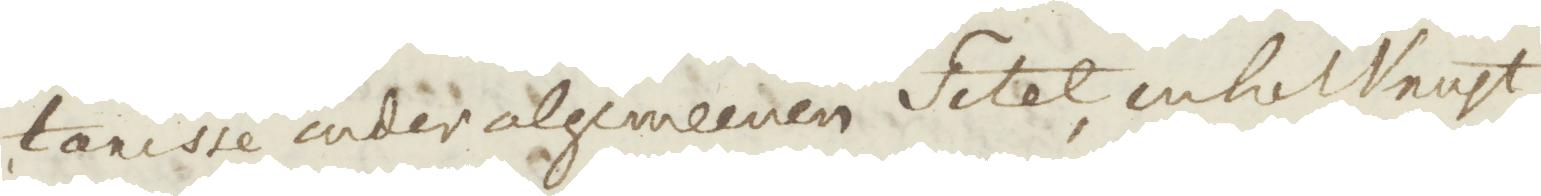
,tarisse onder algemeenen Titel en het Vrugt
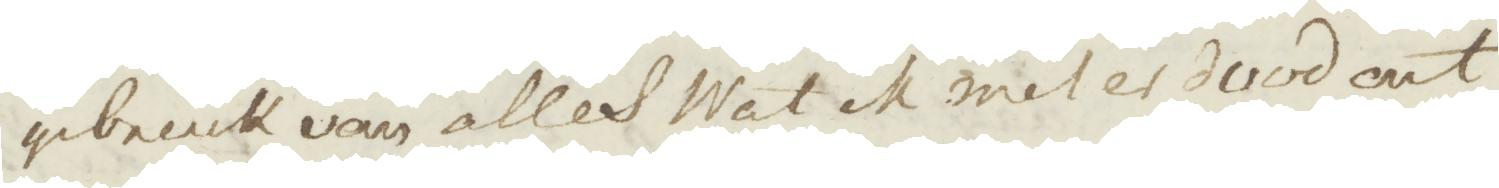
gebruik van alles wat ik met er dood ont
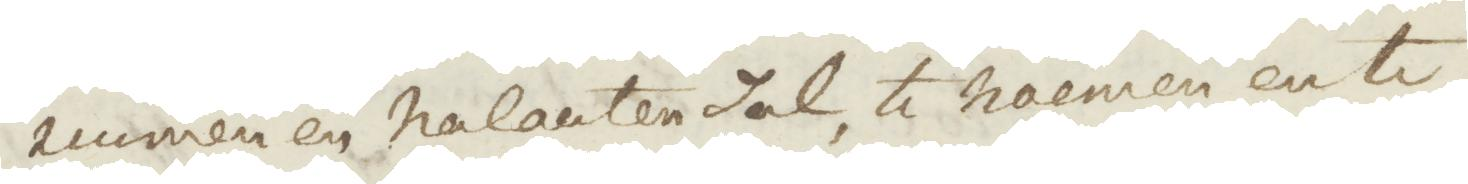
ruimen en nalaaten zal, te noemen en te
